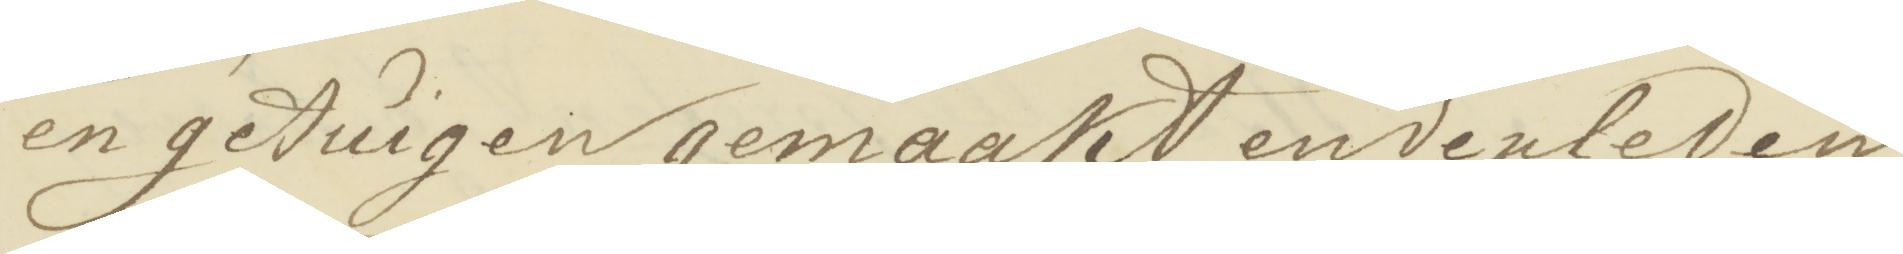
en getuigen gemaakt en verleden
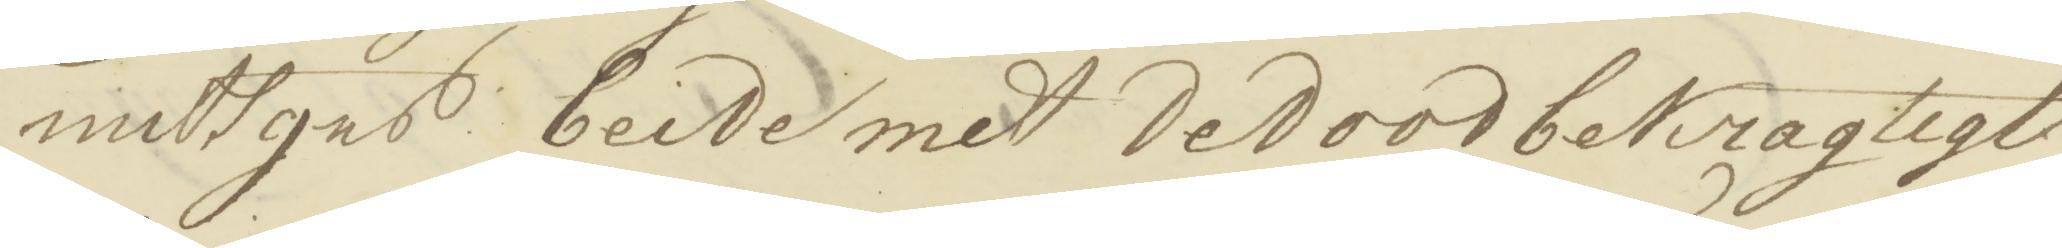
mitsgrs: beide met de dood bekragtigt
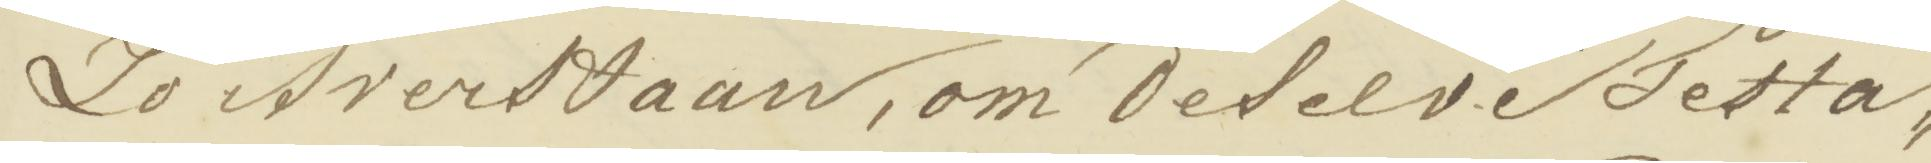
Zo is verstaan, om deselve Testa„
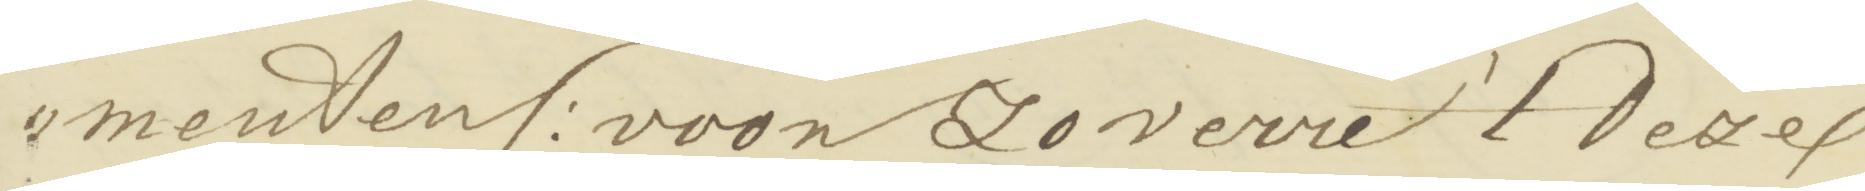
„menten (: voor zo verre ’t deze
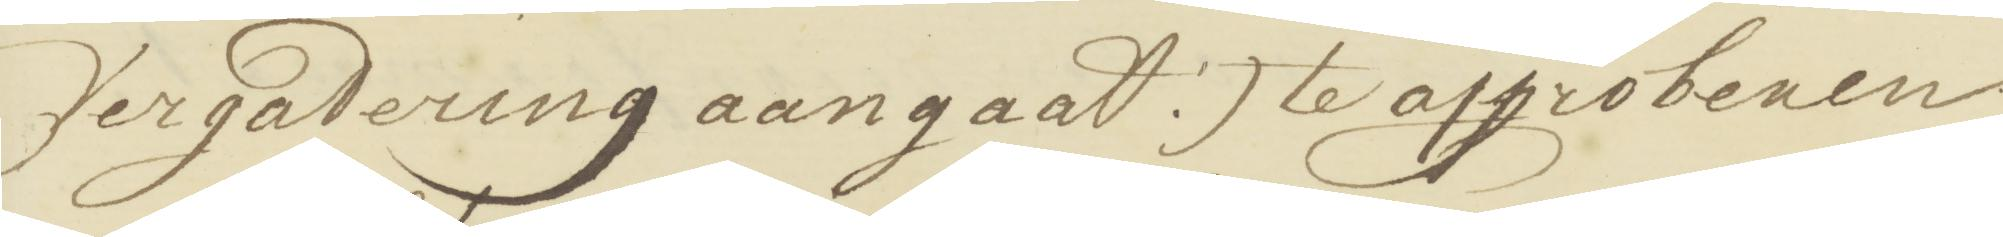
Vergadering aangaat: ) te approberen
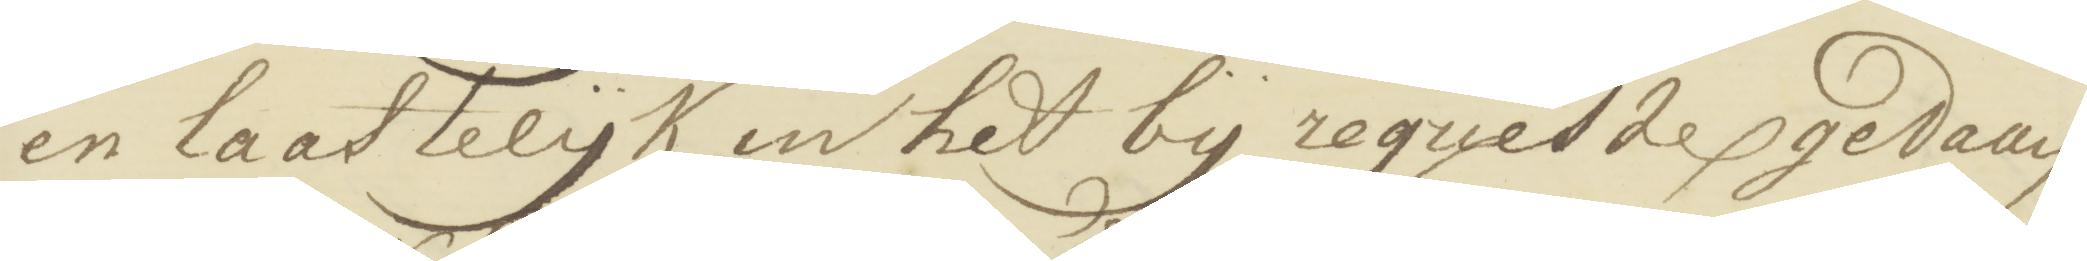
en laastelijk in het bij requeste gedaan
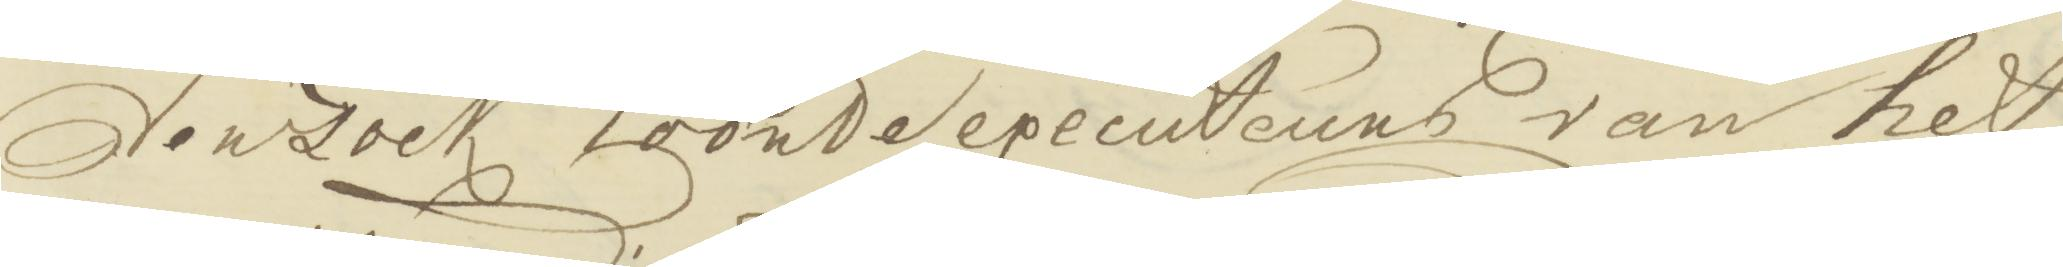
Verzoek voor de executeurs van het
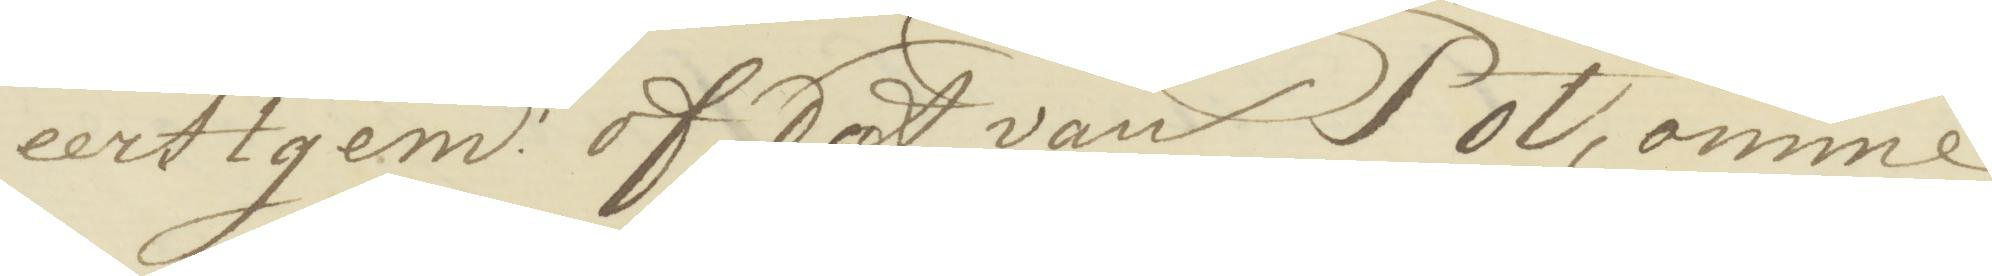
eerstgem: of dat van Pot, omme
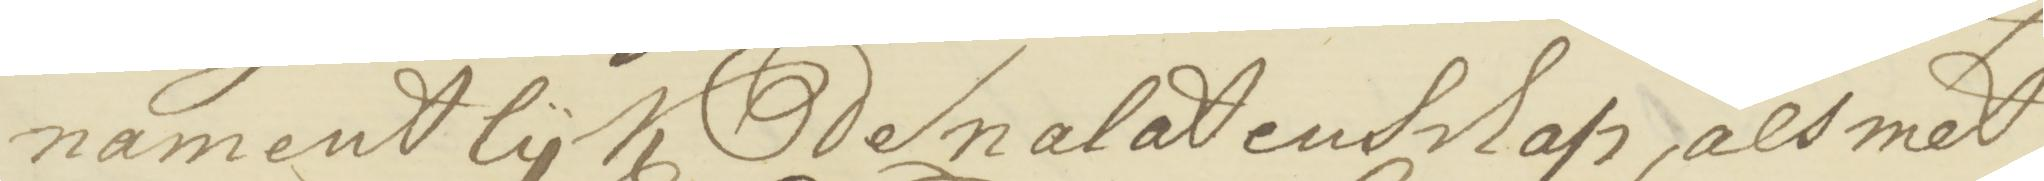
namentlijk de nalatenschap, als met
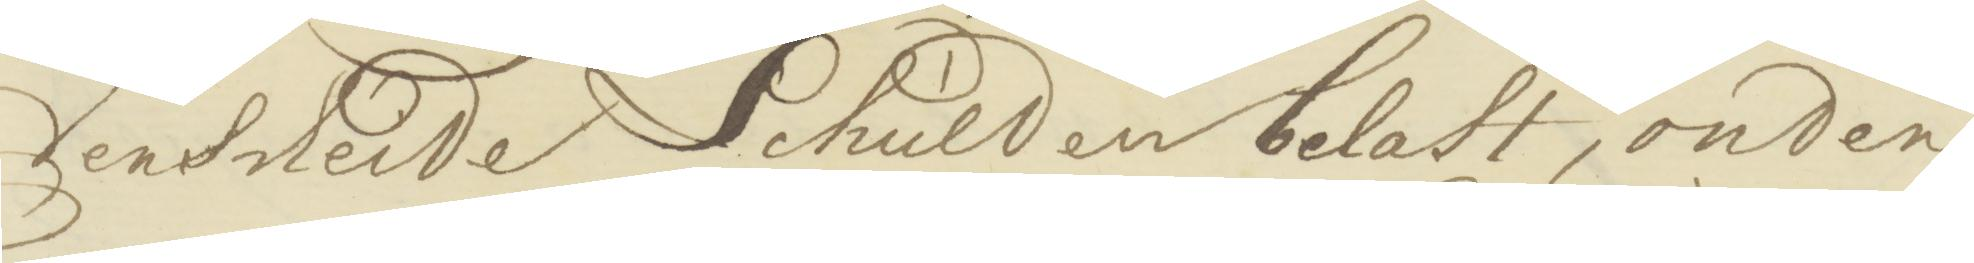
verscheide Schulden belast, onder
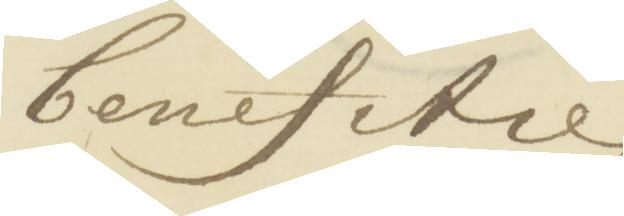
benefitie
